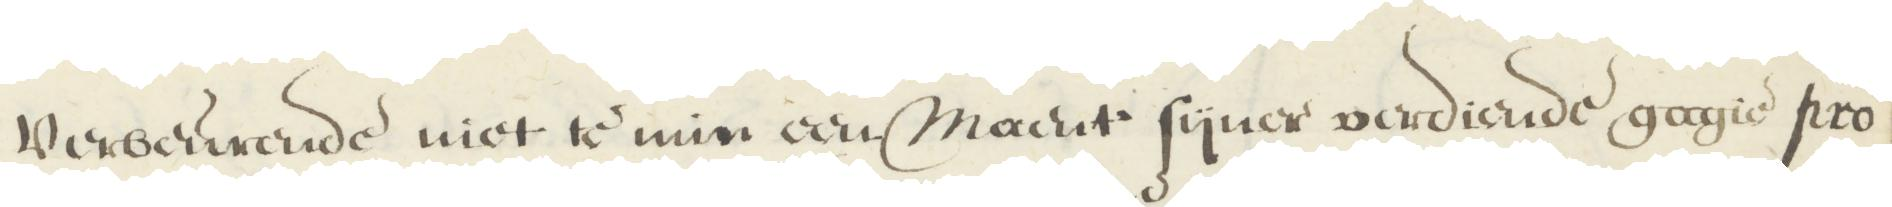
Verbeurende niet te min een Maent sijner verdiende gagie pro
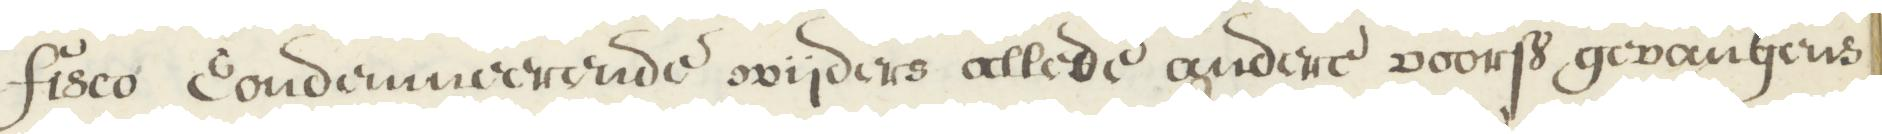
fisco Condemneerende wijders alle de andere voorsz gevangens
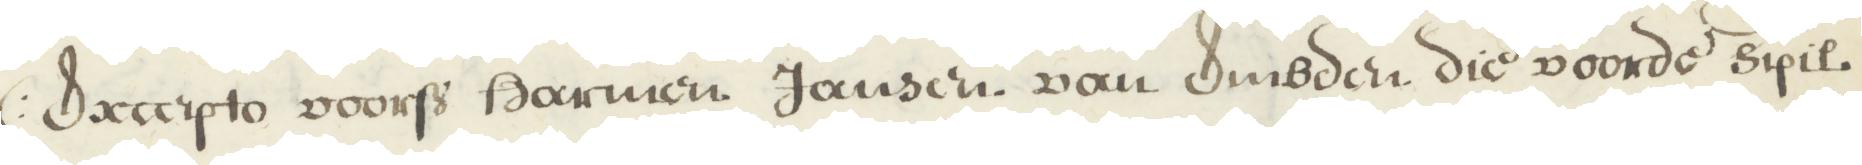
(:Excepto voorsz harmen Jansen van Embden die voor de spil
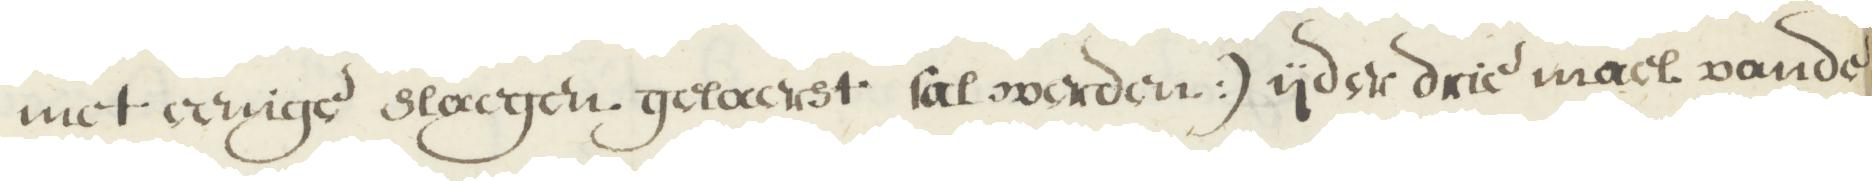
met eenige slaegen gelaerst sal werden:) ijder drie mael van de
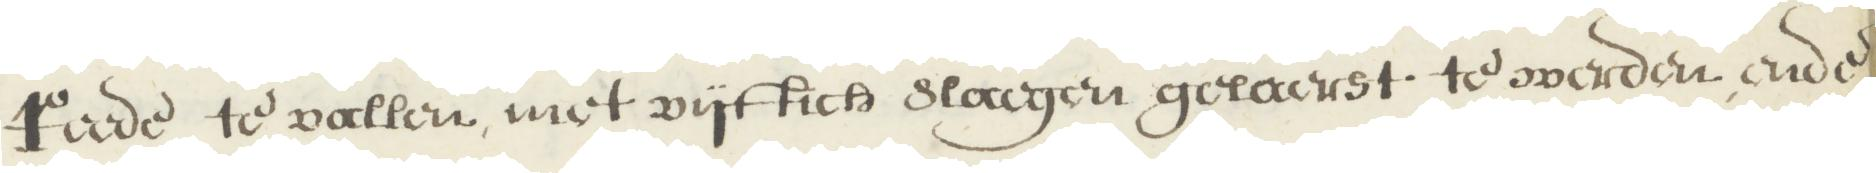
Reede te vallen, met vijftich slaegen gelaerst te werden ende
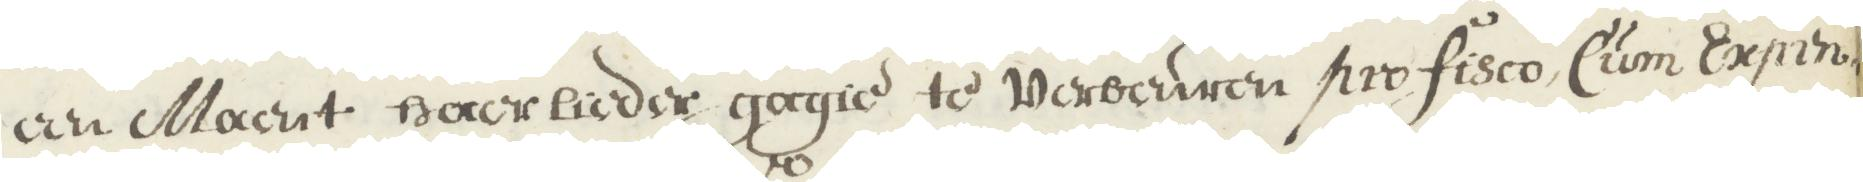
een Maent haer lieder gagie te verbeuren pro fisco, Cum Expen„
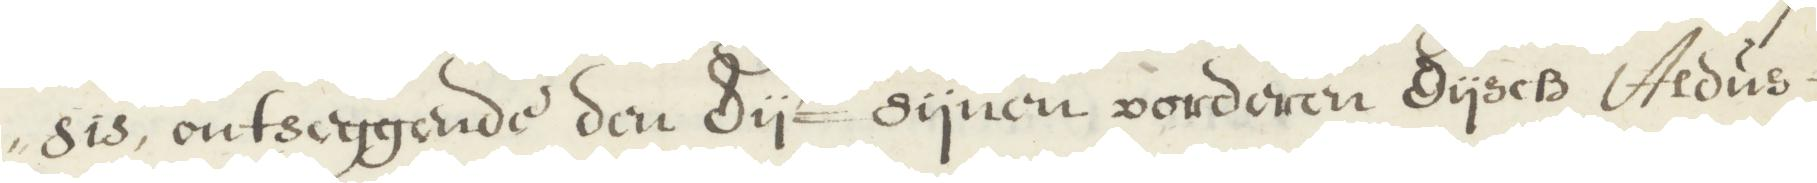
„sis, ontseggende den Eij=r sijnen vorderen Eijsch Aldus
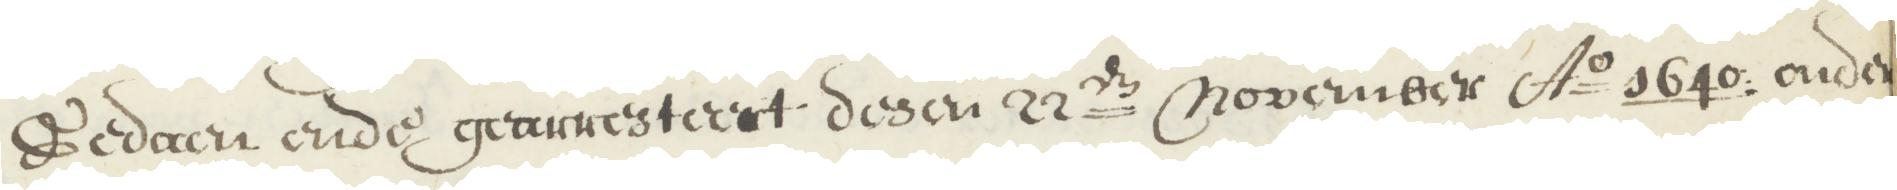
gedaen ende gearresteert desen 22=en November A=o 1640: onder
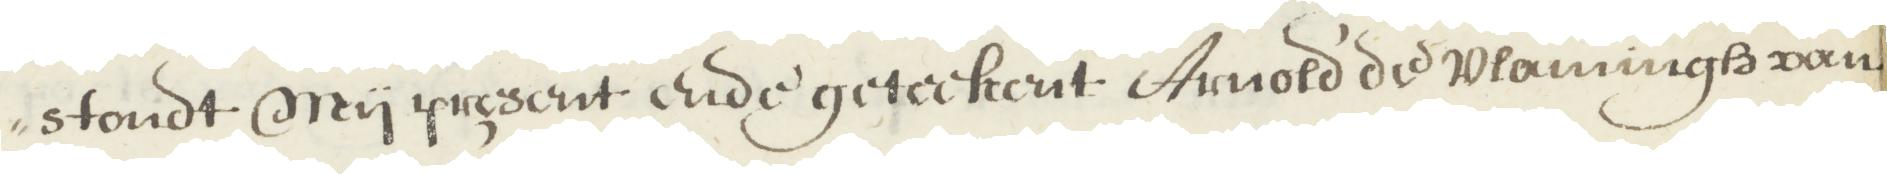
„stondt Mij present ende geteekent Arnold' de Vlamingh van
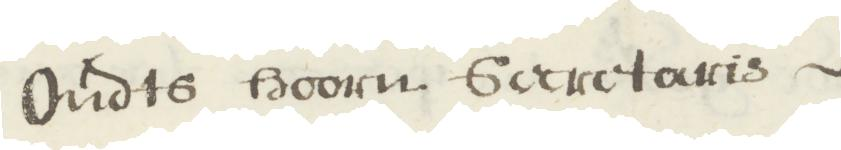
Oudts hoorn Secretaris
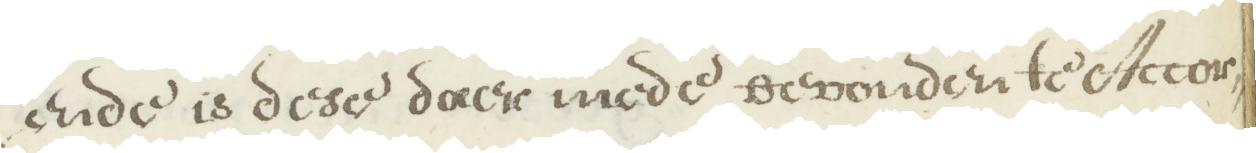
ende is dese daer mede bevonden te Accor„
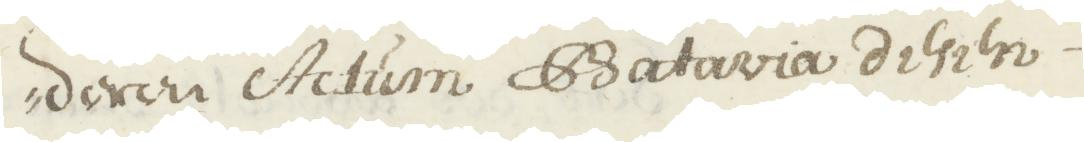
„deren Actum Batavia desen
